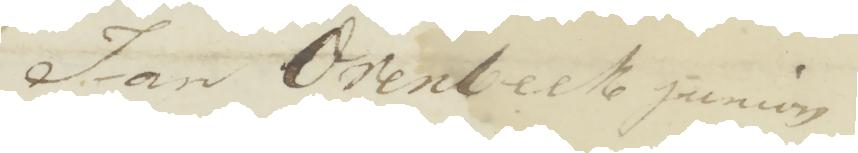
Ian Ovenbeek junior
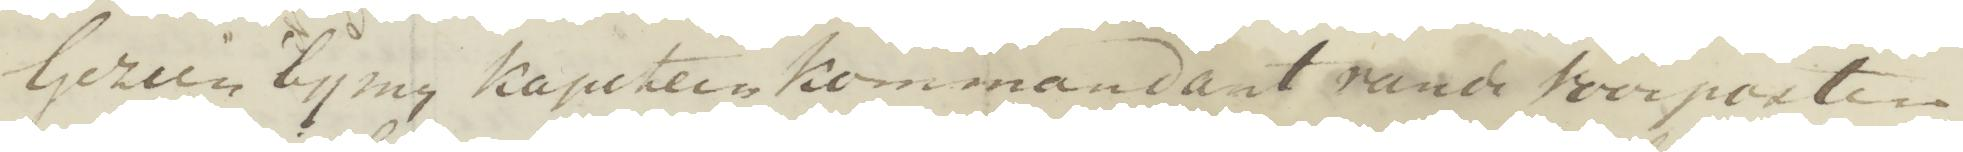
Gezien by my kapitein kommandant van de voorposten
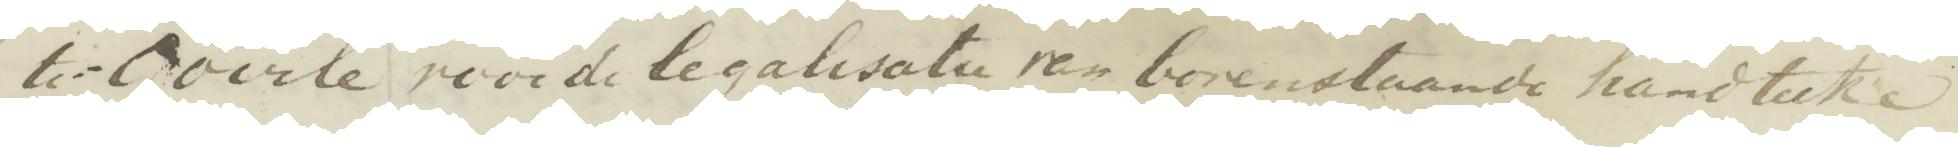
te Goirle voor de legalisatie van bovenstaande handteeke
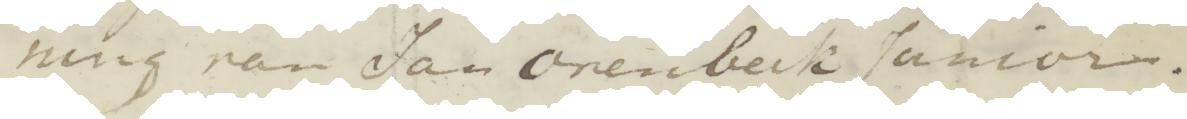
ning van Ian Ovenbeek Junior
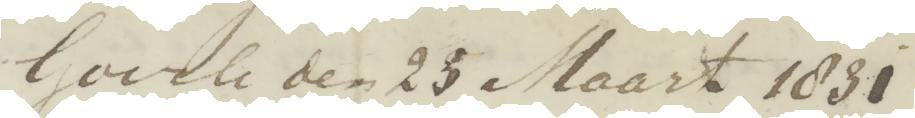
Goirle den 23 Maart 1831
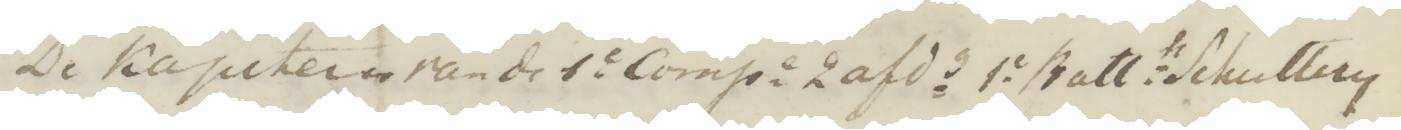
De kapitein van de 1-e en comp=e 2 afd=g 1-e Batt=n Schuttery
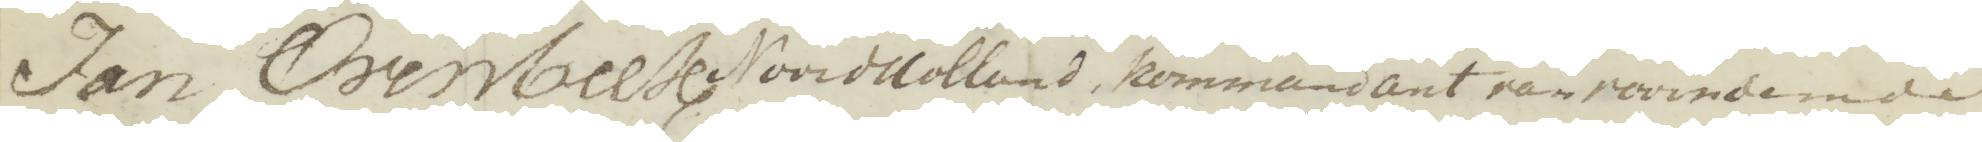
Ian Ovenbeek NoordHolland, kommandant van voornoemde
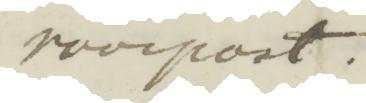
voorpost.
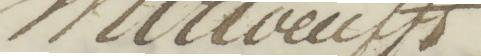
WrrHoeufft
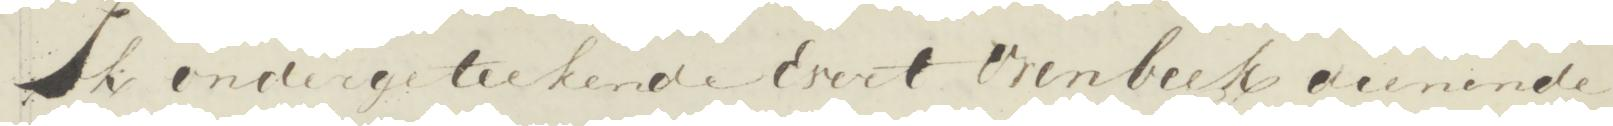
Ik ondergeteekende Evert Ovenbeek dienende
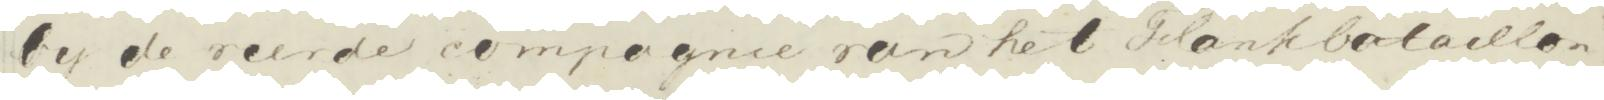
by de vierde compagnie van het Flankbataillon
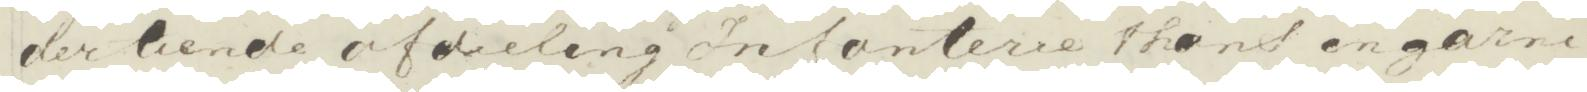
der tiende afdeeling Infanterie thans in garni
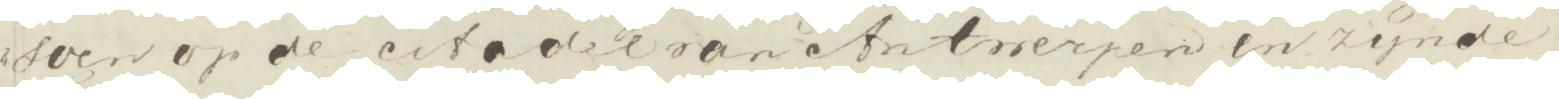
soen op de citadel van Antwerpen en zynde
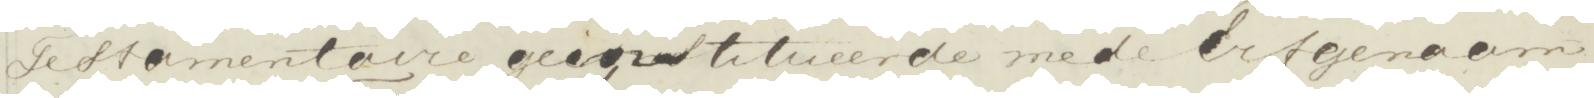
Testamentaire geinstitueerde mede Erfgenaam
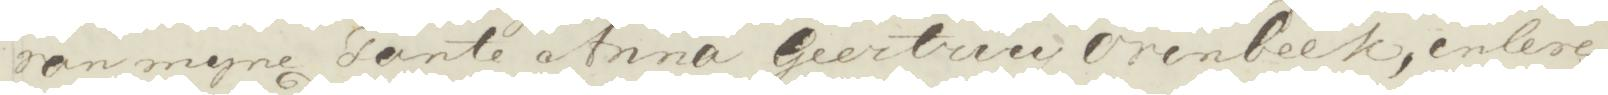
van myne Tante Anna Geertuy Overbeek, in leven
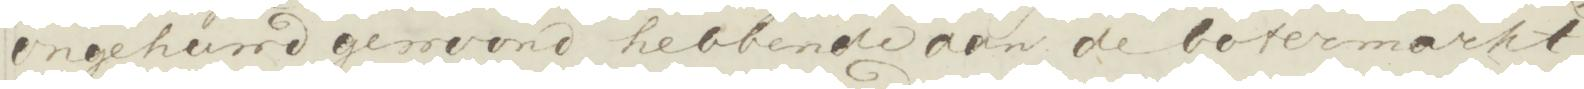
ongehuwd gewoond hebbende aan de botermarkt
